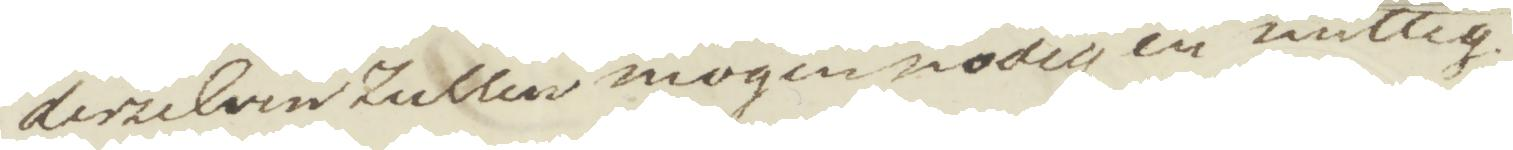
derzelven zullen mogen nodig en nuttig
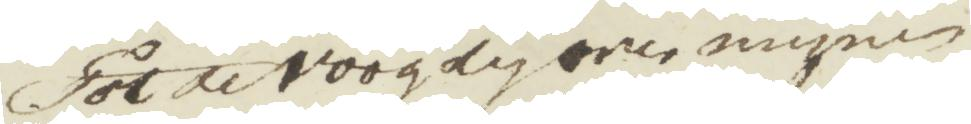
Tot de voogdy over myne
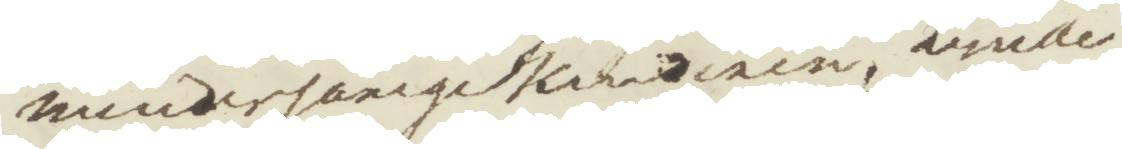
minderjarige kinderen, zynde
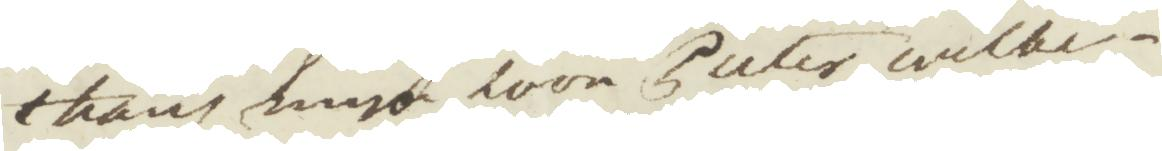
thans myn zoon Pieter, welke
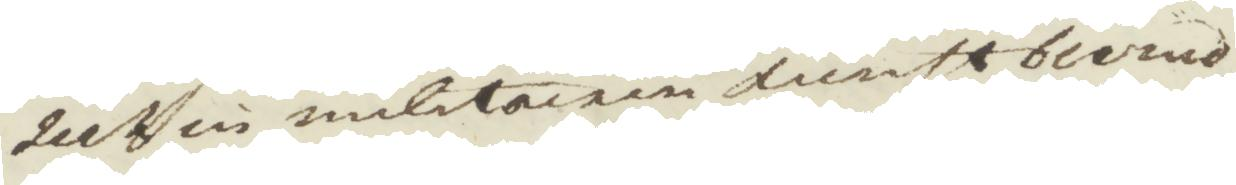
zich in militairen dienst bevind
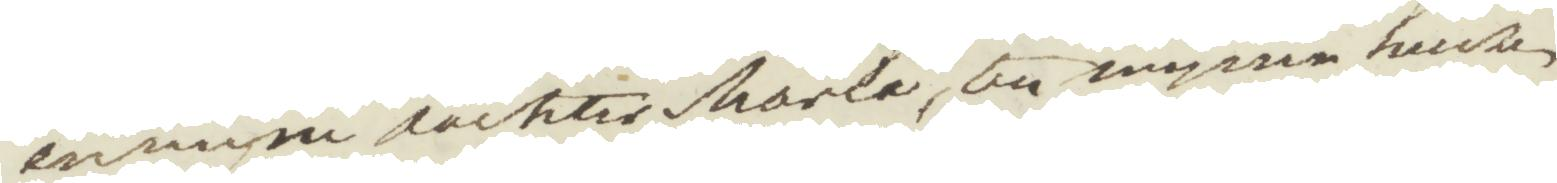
en myne dochter Marta, by mynen huizen
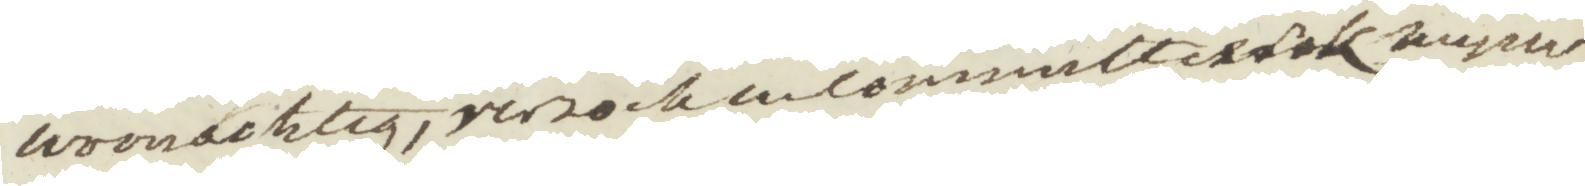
woonsagtig, verzoek en committeer ik myne
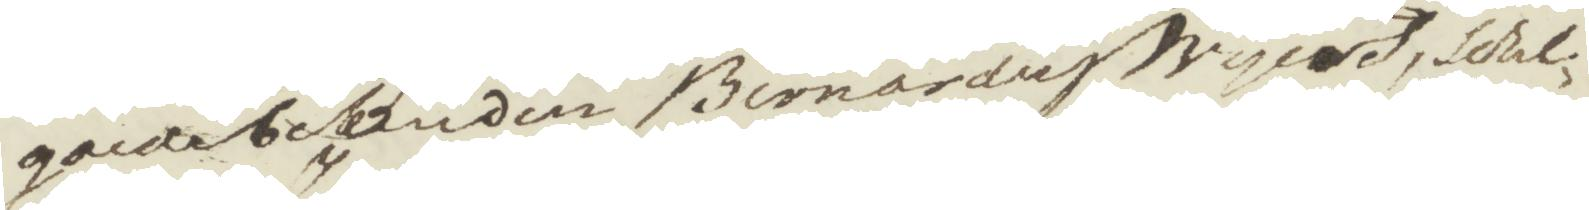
goede bekenden Bernardus Wyers, schil=
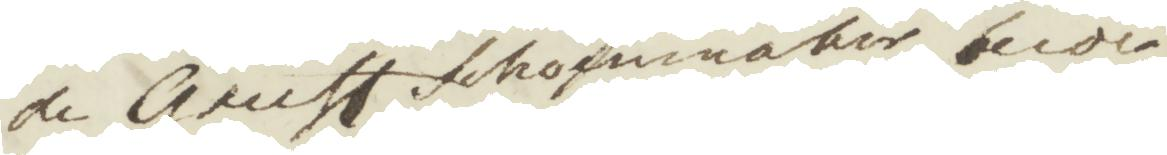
der en J. de Greff schoenmaker, beide
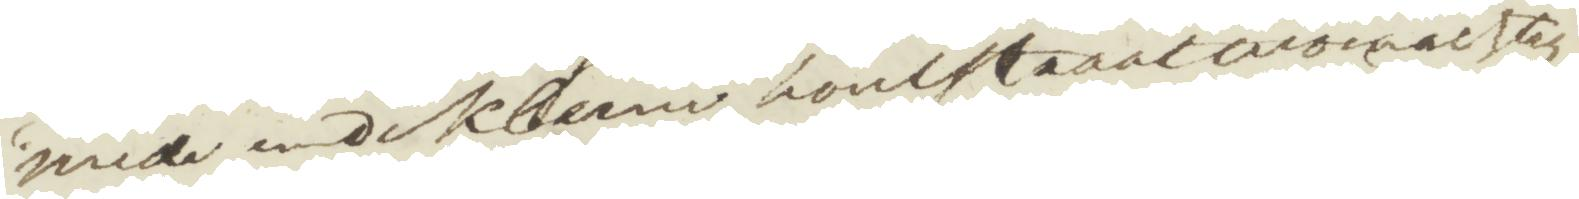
mede in de kleine houtstraat woonachtig
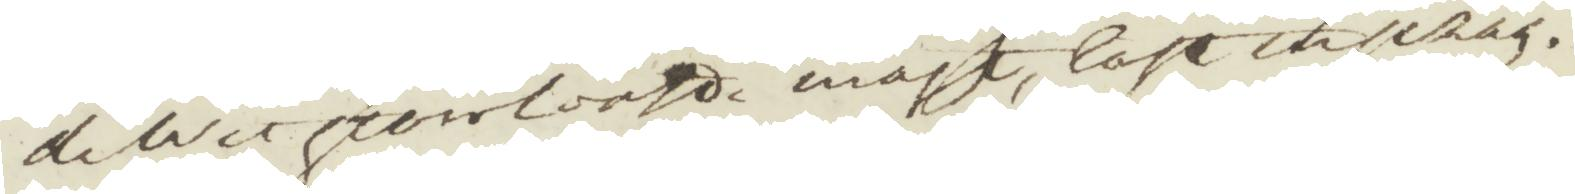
de wet geoorloofde magt, last en gezag.
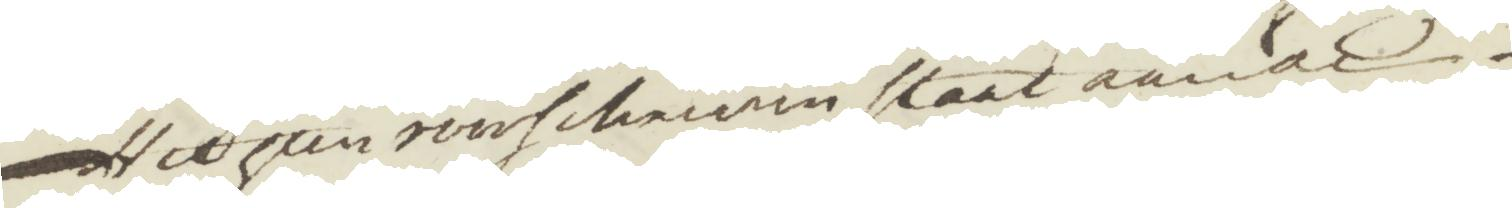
Het geen voorschreven staat aan de
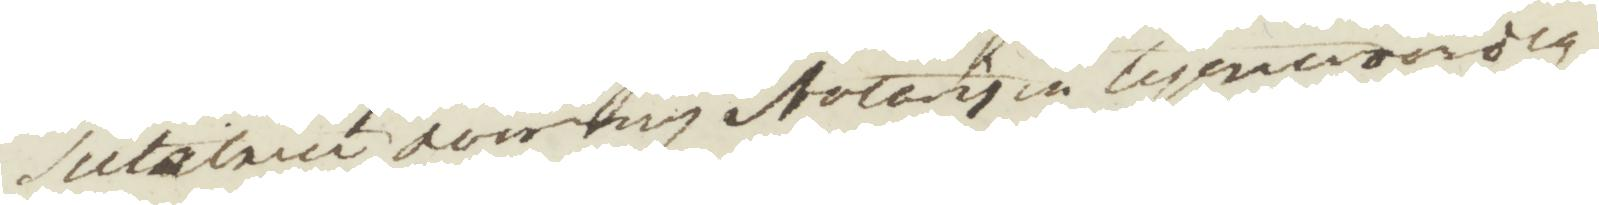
Testatrice door my Notaris in tegenwoordig
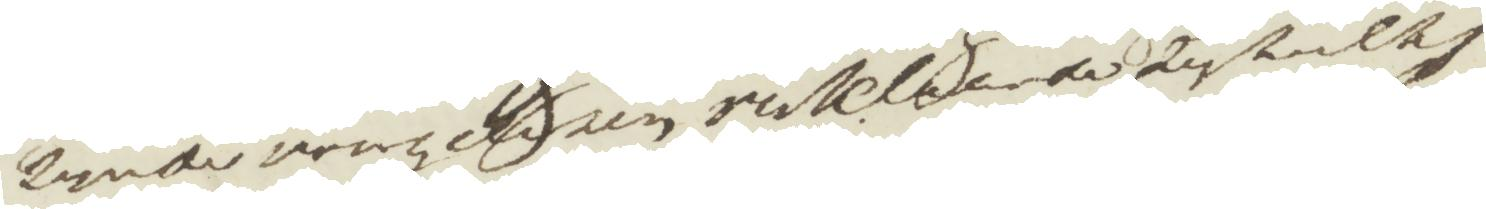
zynde voorgelezen verklaarde zy zulks
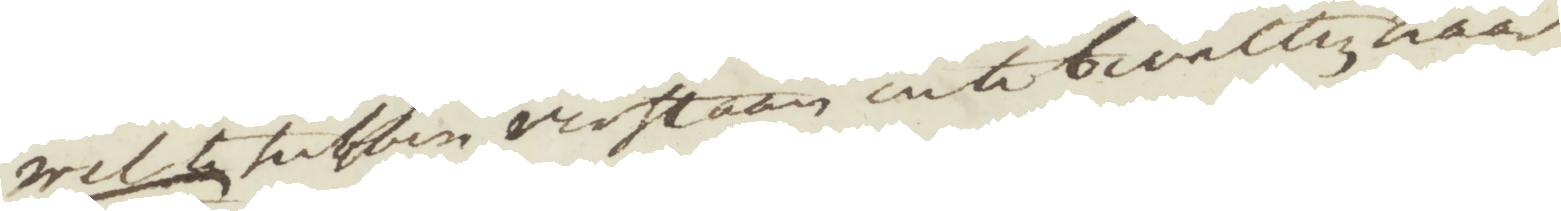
wel te hebben verstaan en te bevatten haar
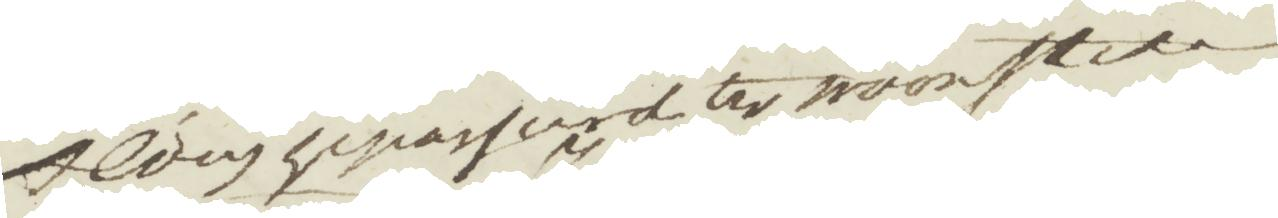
Aldus gepasseerd, ter woonstede
